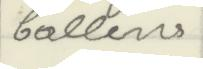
ballens
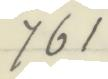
761
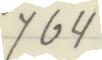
764
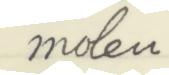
molen
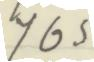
765
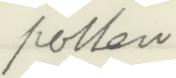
potten
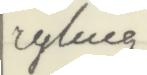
rytuig
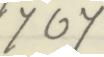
767
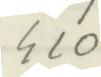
410
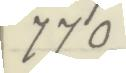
770
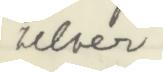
zilver
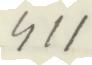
411
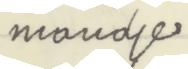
mandje
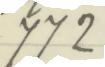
772
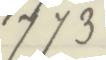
773
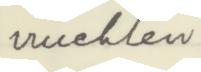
vruchten
